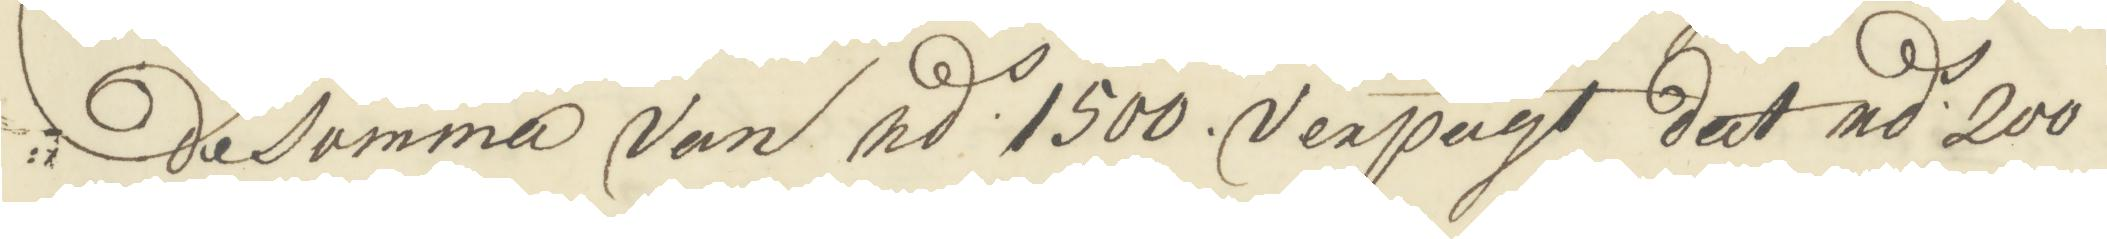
de somma van rd's 1500. verpagt dat rd's 200
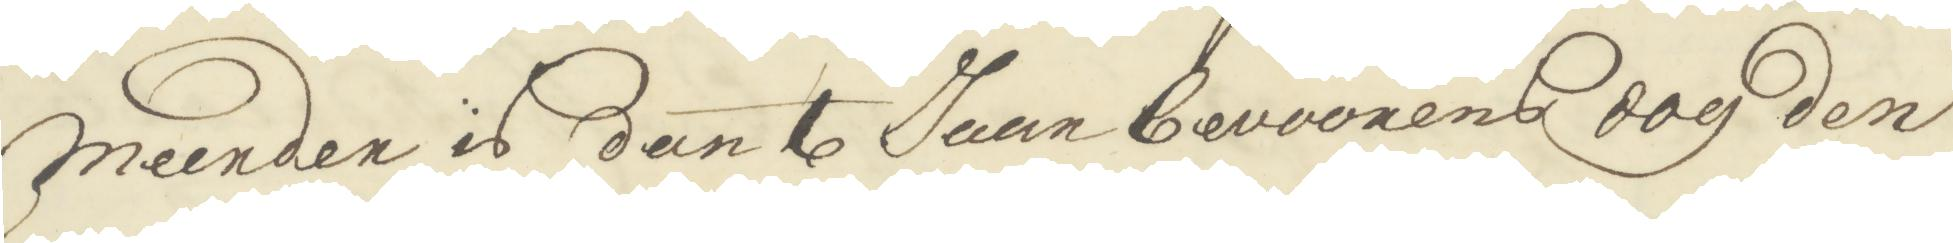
meerder is dan t Jaar bevoorens dog den
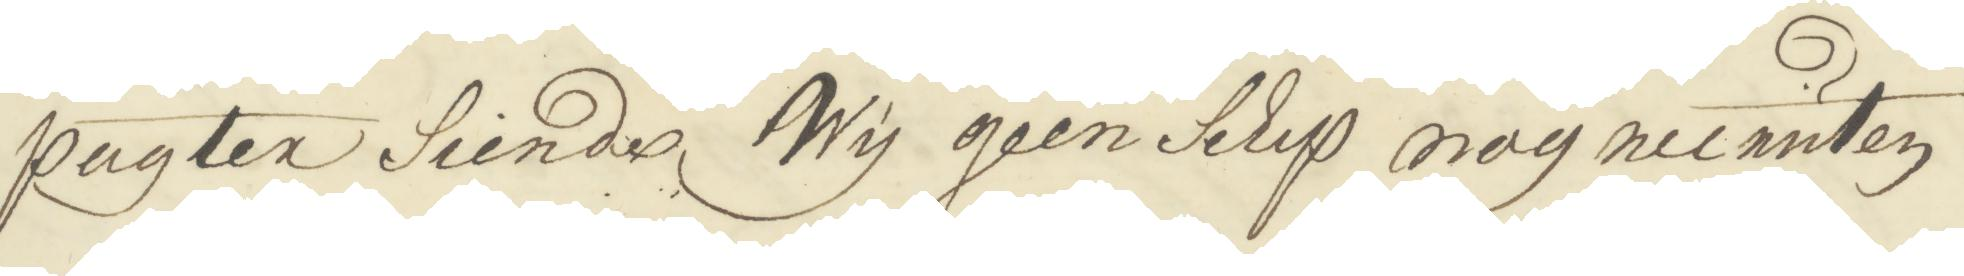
pagter siende Wij geen schip nog recruten
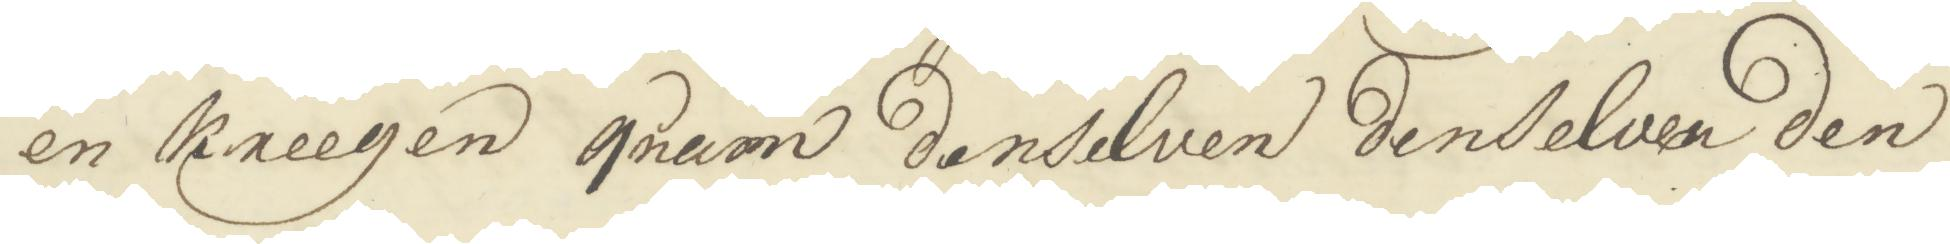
en kreegen quam denselven denselven den
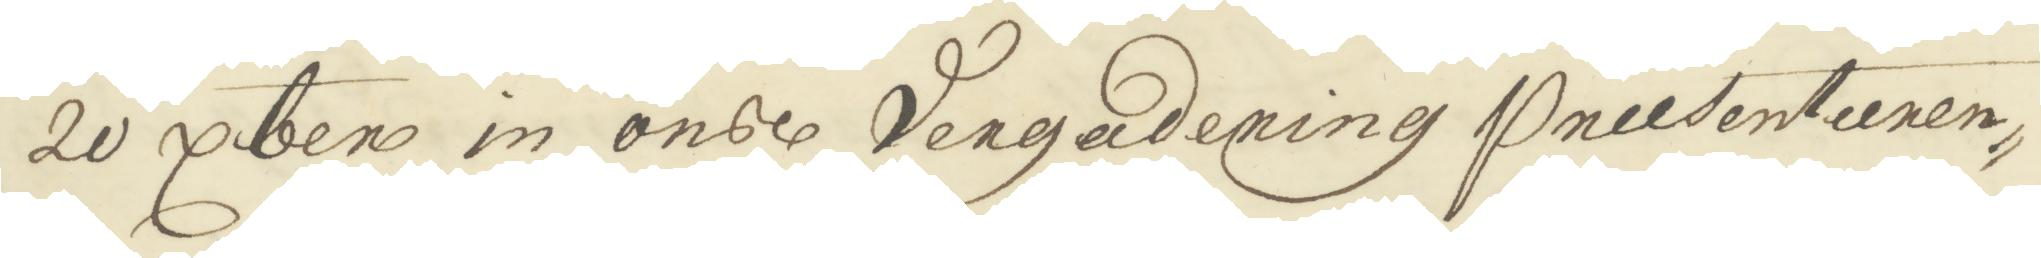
20 xber in onse Vergadering Preesenteeren„
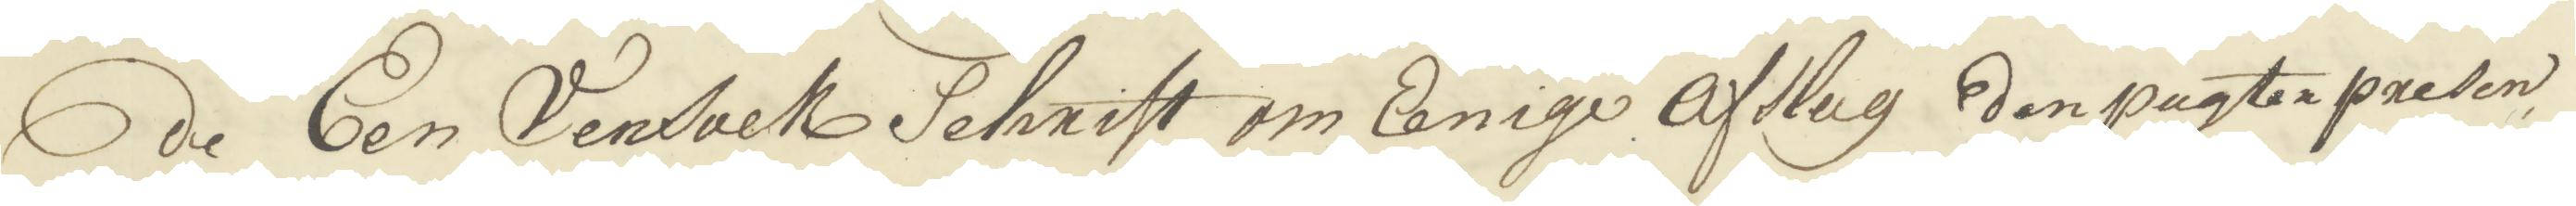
de Een Versoek schrift om Eenige Afslag den pagter presen,
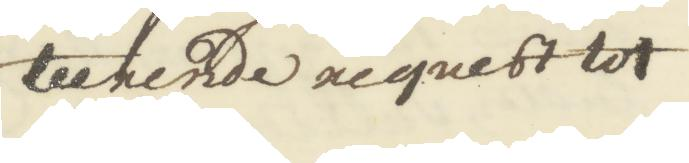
teerende request tot
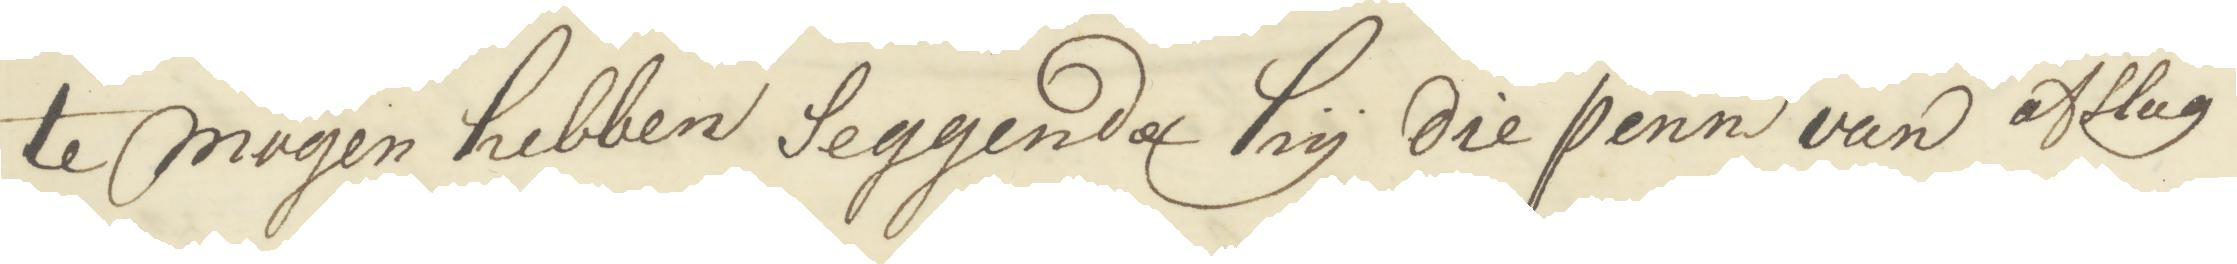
te mogen hebben seggende hij die penn van afslag
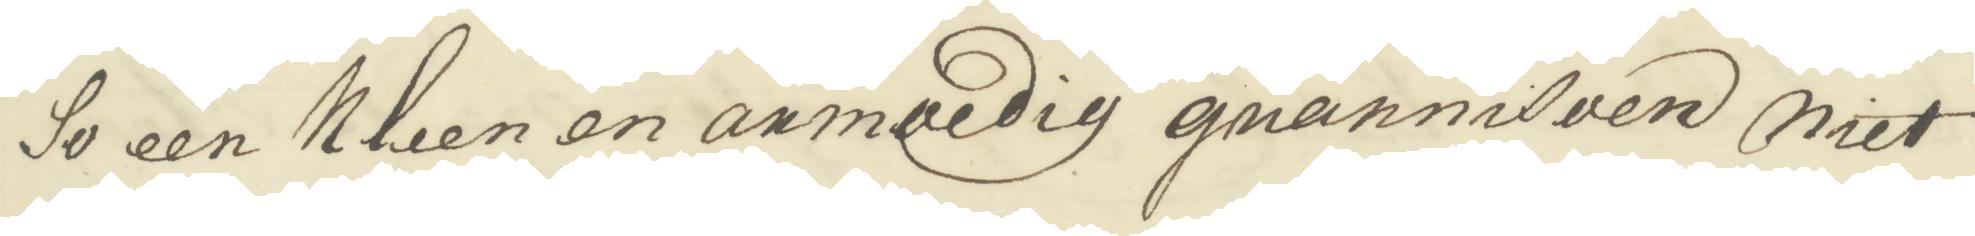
so een kleen en armoedig guarnisoen niet
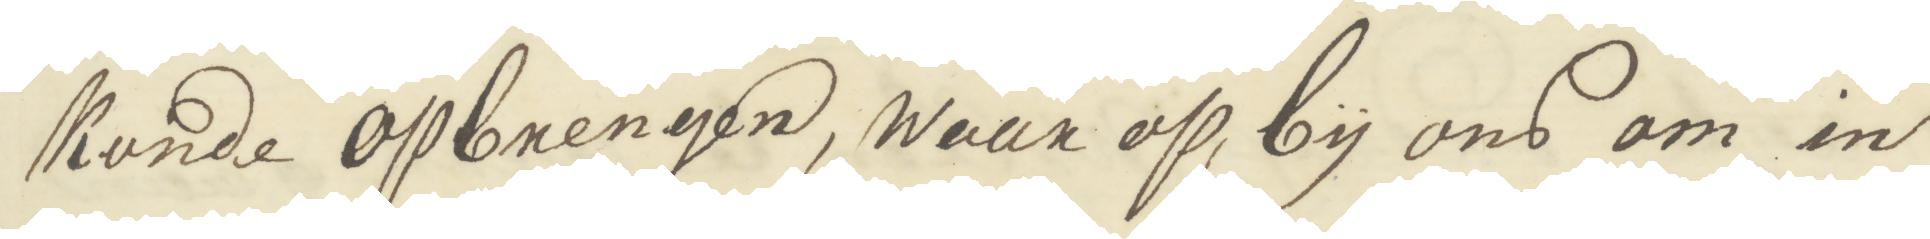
konde opbrengen, waar op bij ons om in
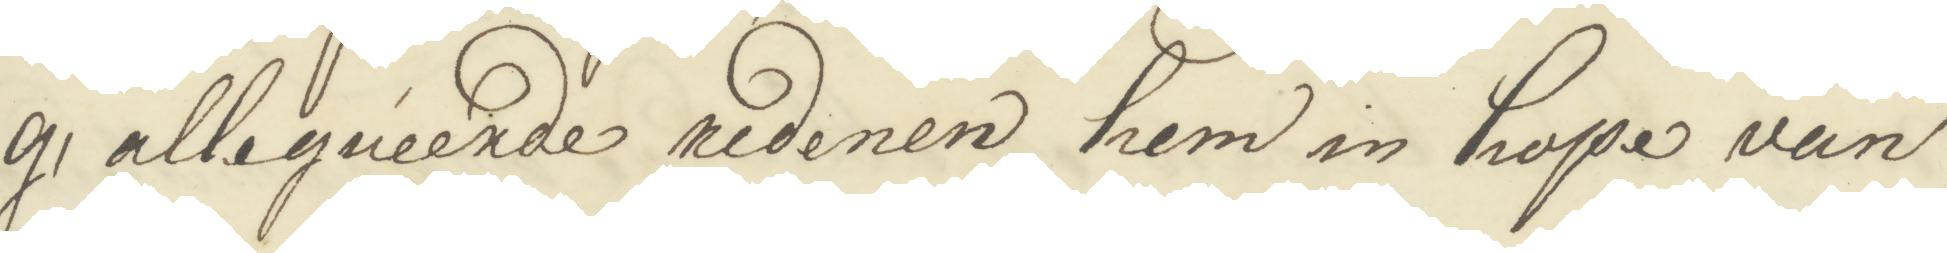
g' allegueerde redenen hem in hope van
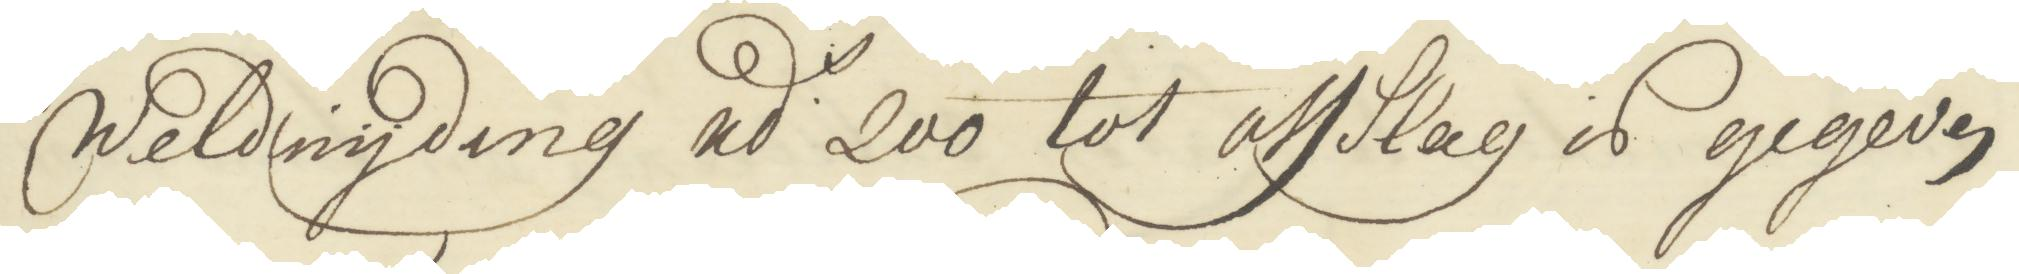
Welduijding rd's 200 tot afslag is gegeven
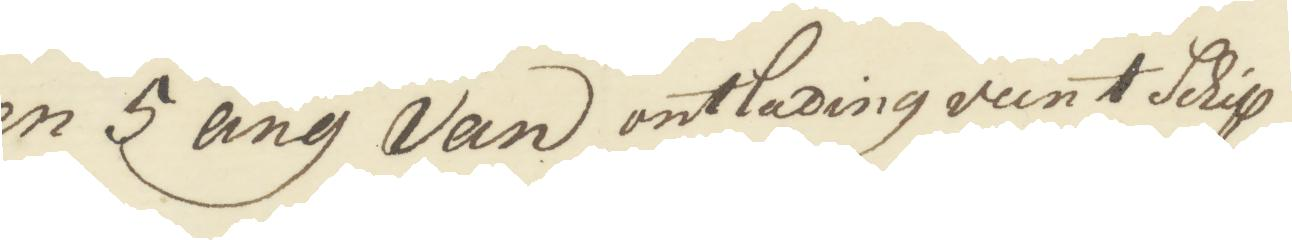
5 aug van ontlading van t schip
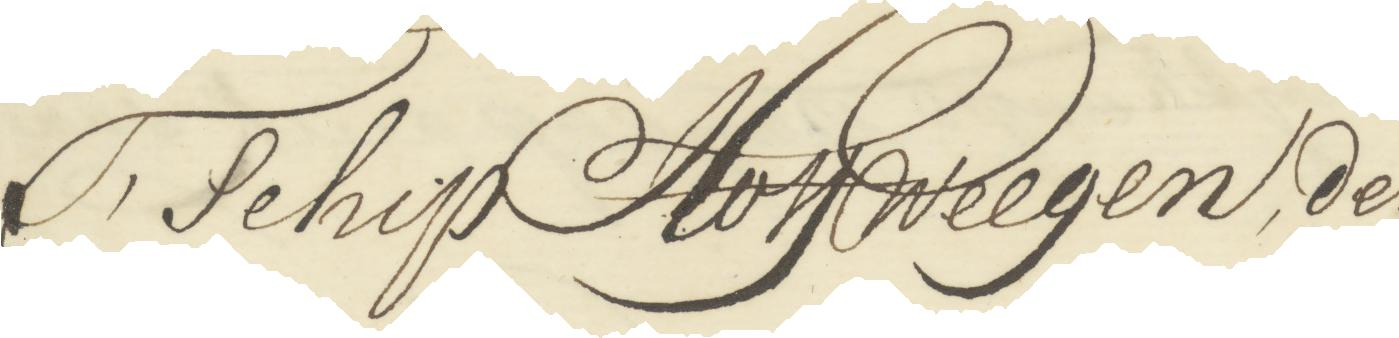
T' schip Hoffweegen, den
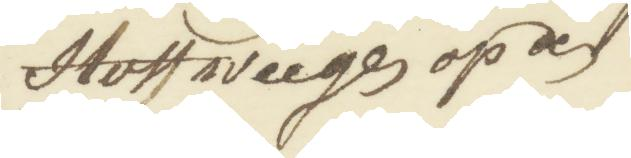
Hoffweegen op den
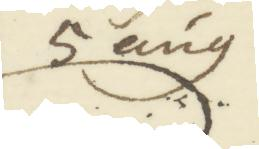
5 aug
